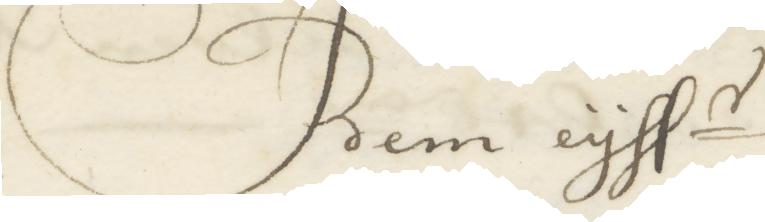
Jdem eijss=r
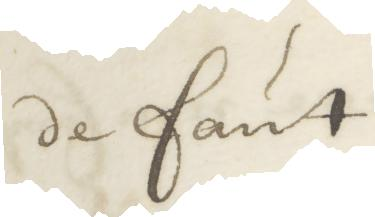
defaut
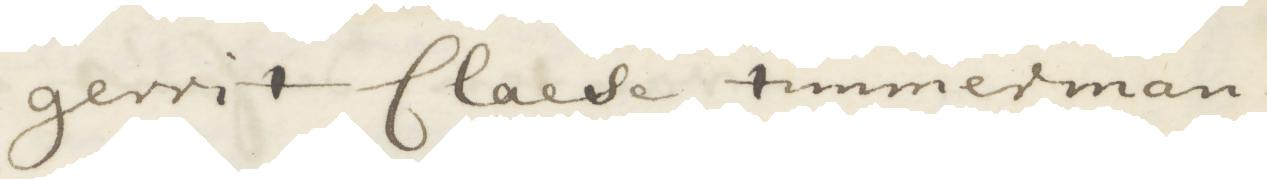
gerrit Claese timmerman
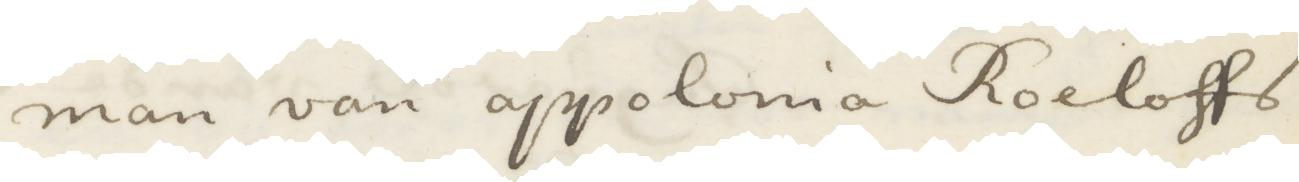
man van appolonia Roeloffs
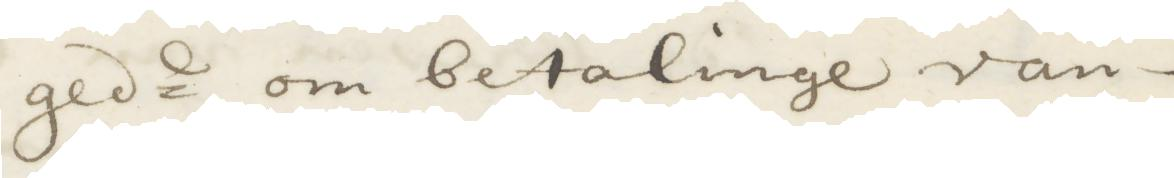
ged=e om betalinge van
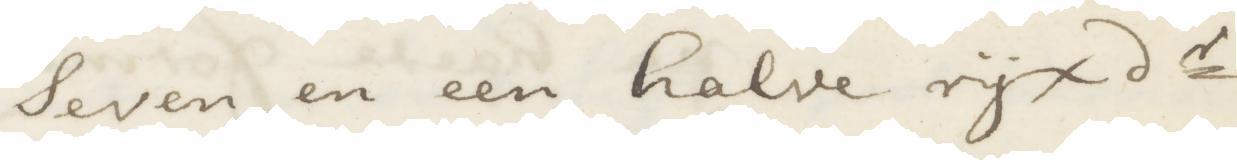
seven en een halve rijxd=r
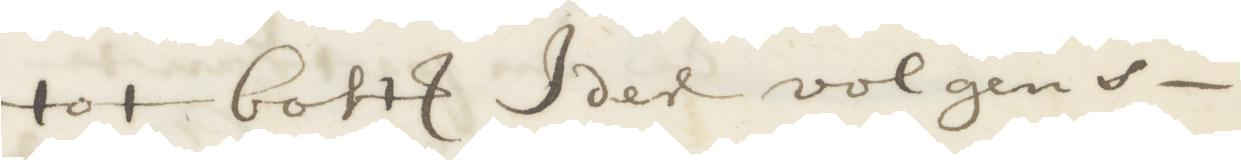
tot 60 stver Jder volgens —
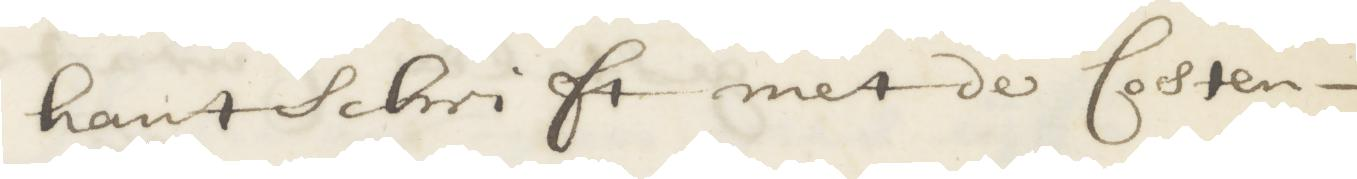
hantschrift met de Costen —
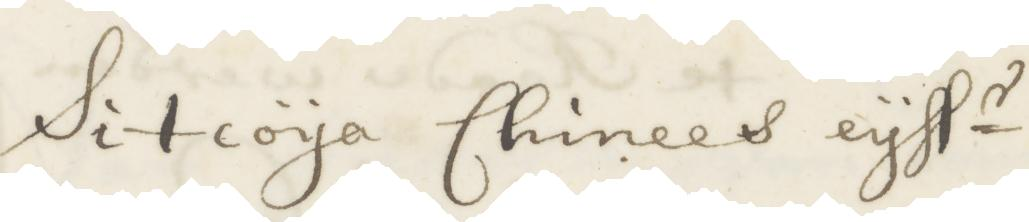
Sitcoija Chinees eijss=r
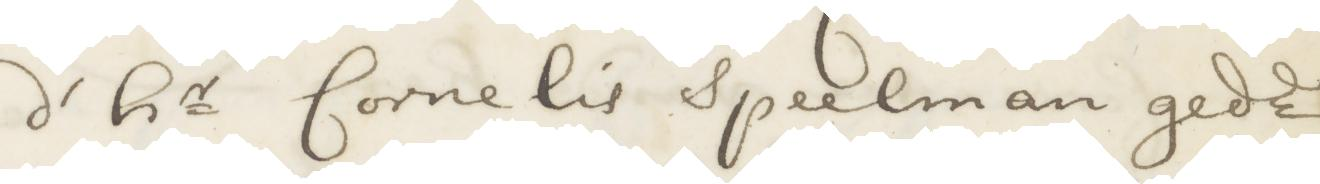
d’ H=r Cornelis speelman ged=e
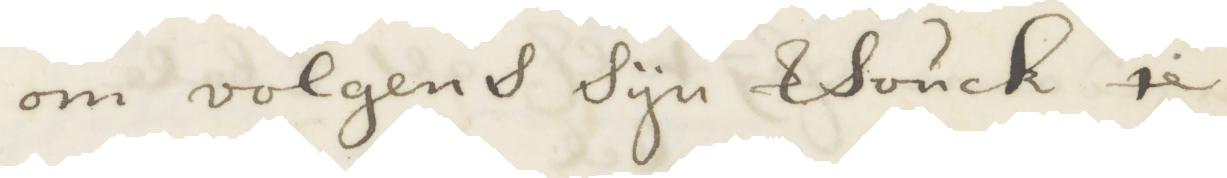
om volgens sijn versouck te
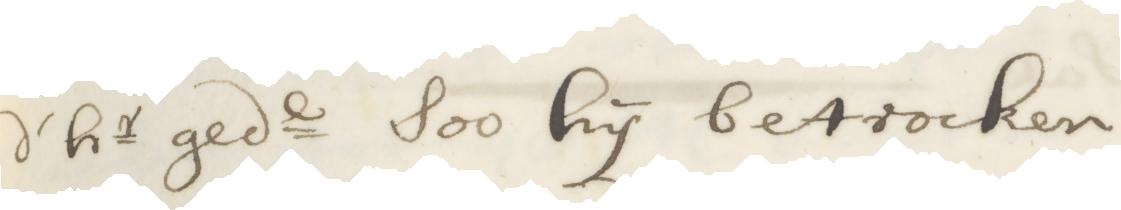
d’ H=r ged=e soo hij betrocken
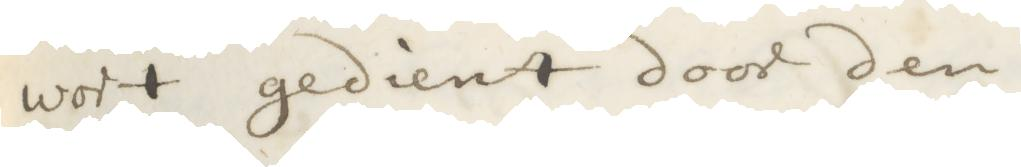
wort gedient door den
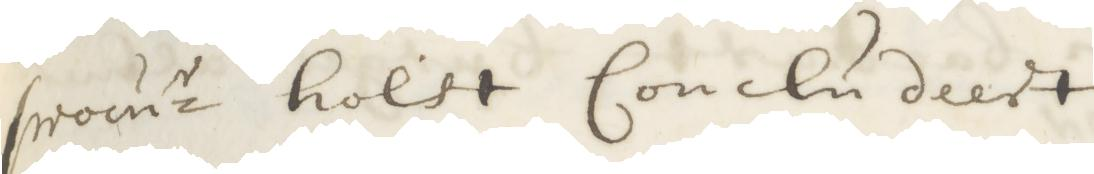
procu=r holst Concludeert
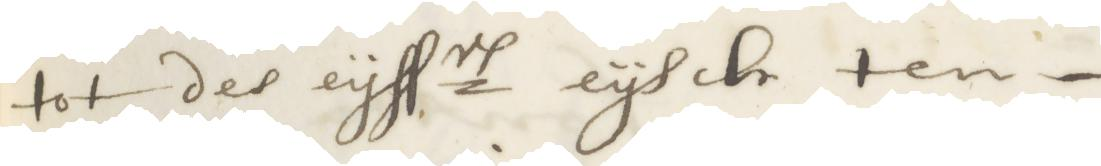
tot des eijss=rs eijsch ten —
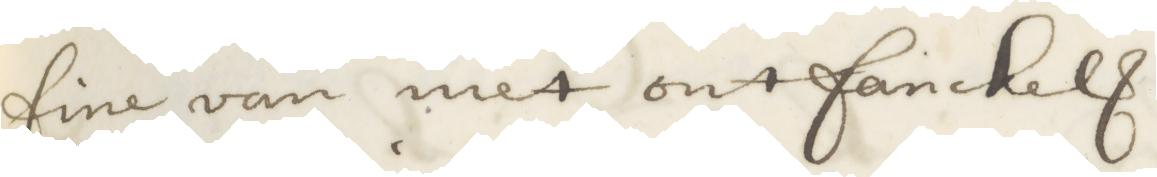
fine van niet ontfanckelijk
